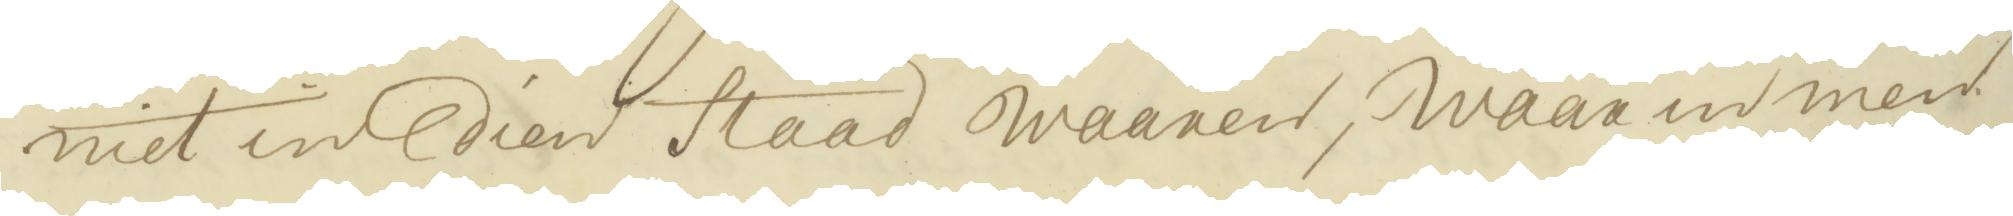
niet in dien staad waaren, waar in men
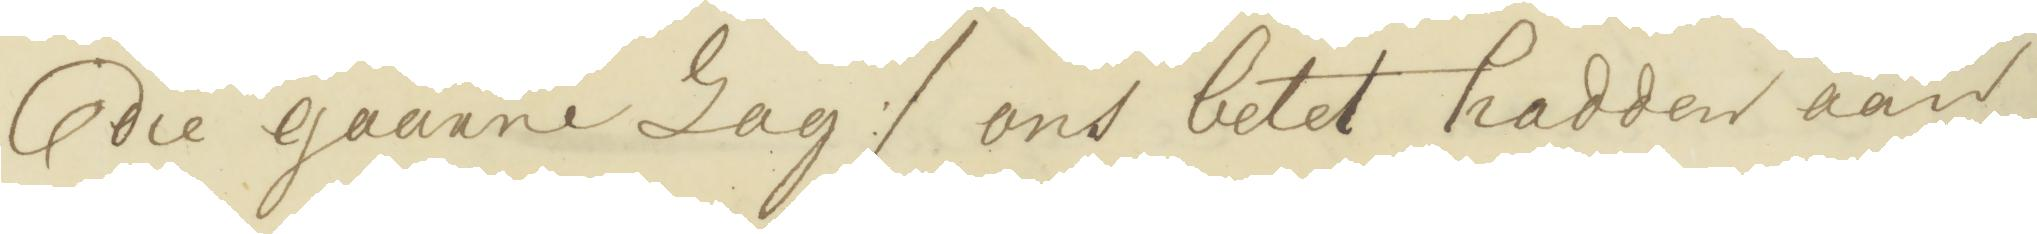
die gaarne zag:/ ons belet hadden aan
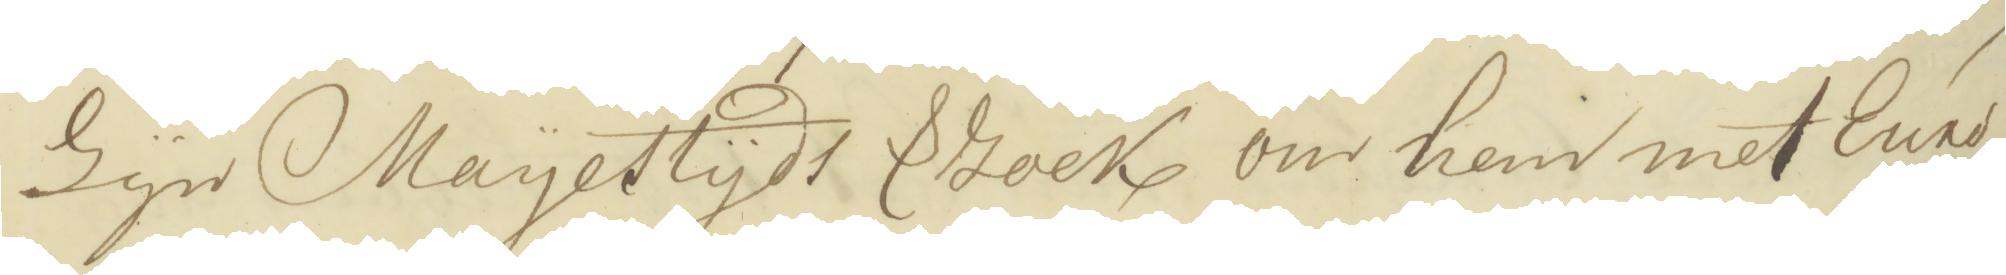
zijn Maijestijds verzoek om hem met Euro
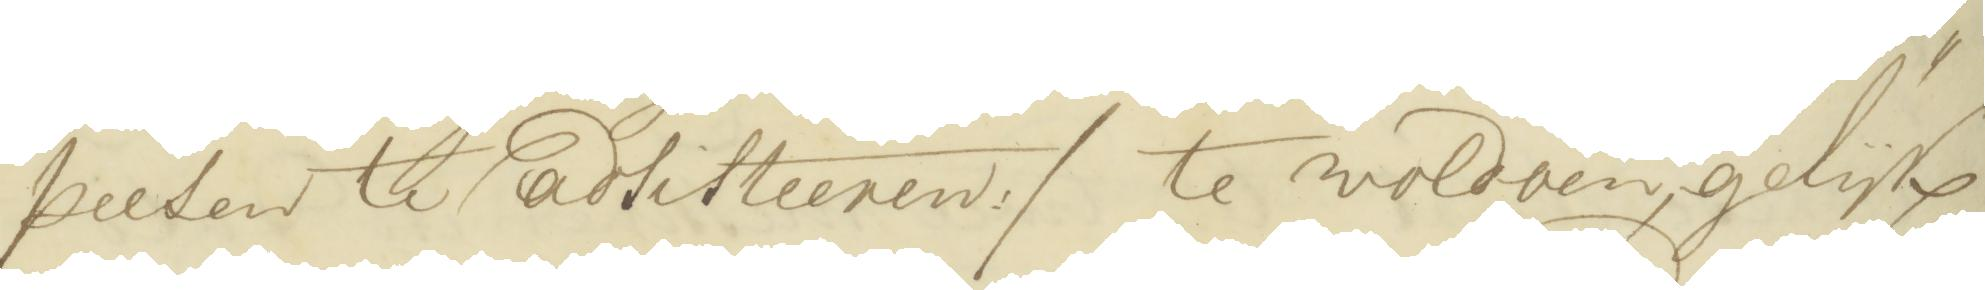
peesen te adsisteeren:/ te voldoen, gelijk
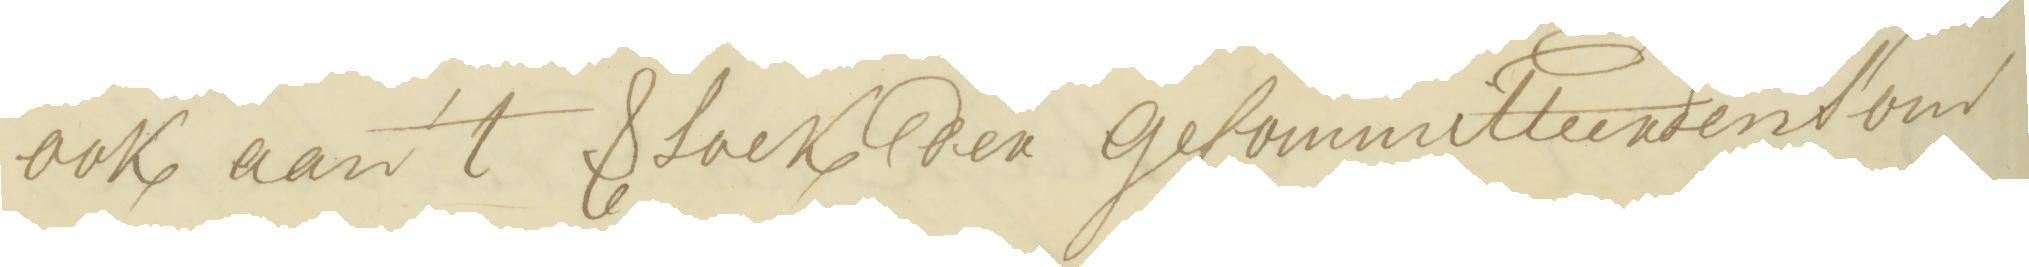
ook aan ’t versoek der gecommitteerdens ons
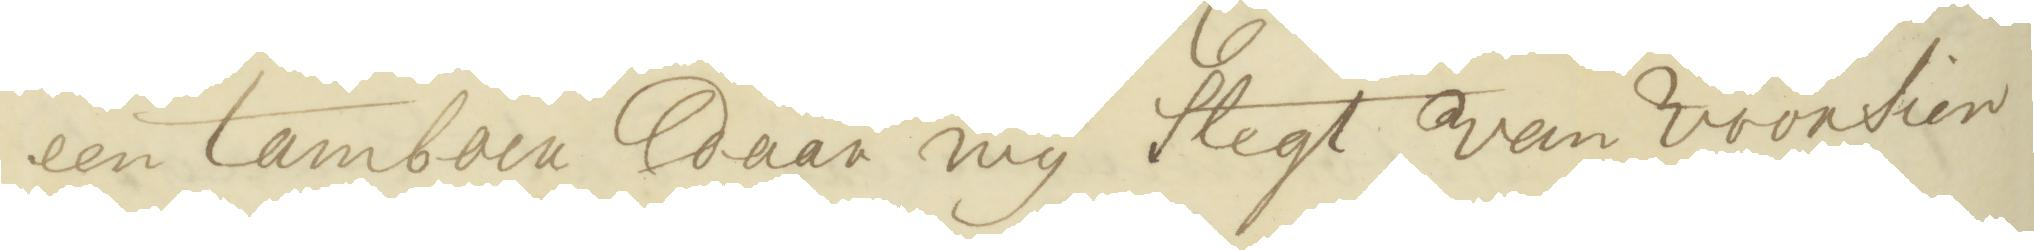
een tamboer daar wij slegt van voorsien
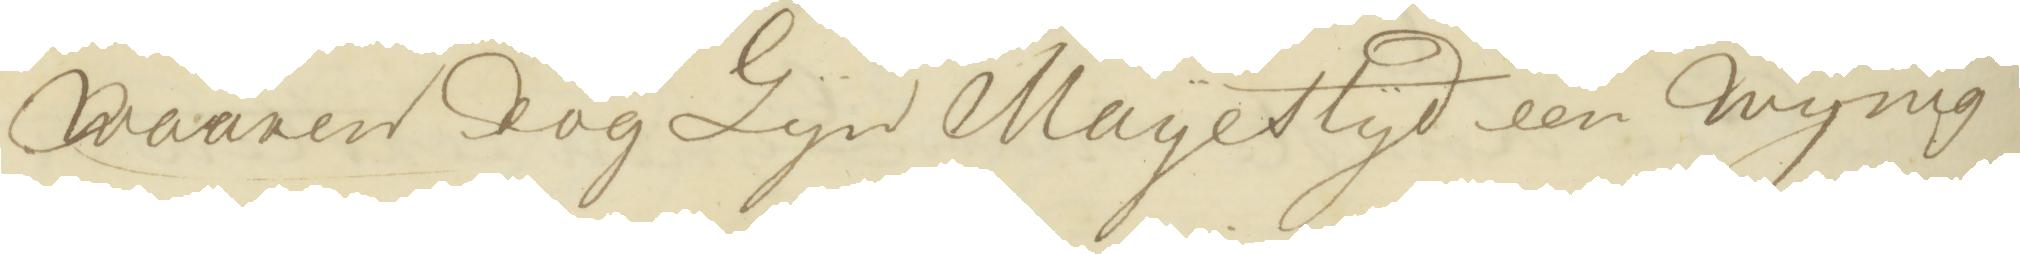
waaren dog zijn Maijestijd een wijnig
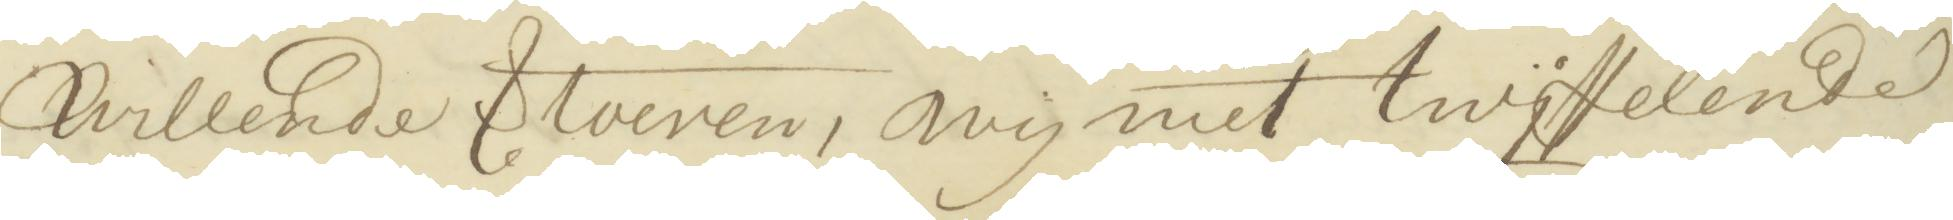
willende vertoeven, wij niet twijffelende
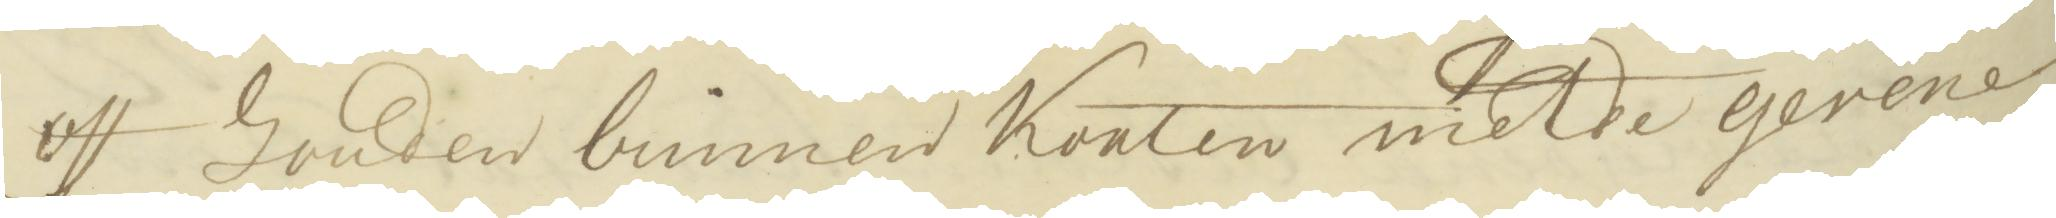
off zouden binnen Korten niet de gevene
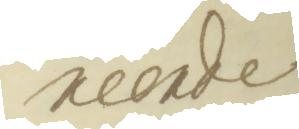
reerde
